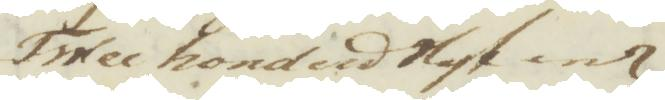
Twee honderd vyf en
